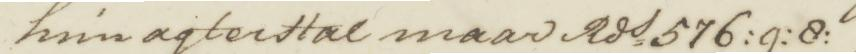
hun agterstal maar Rd=s 576:9:8:
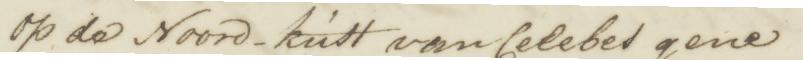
op de Noord-kust van Celebes gene
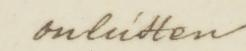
onlusten
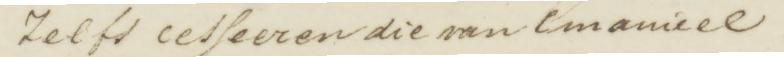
zelfs cesseeren die van Emanuel
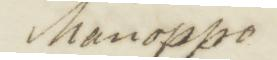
Manoppo
